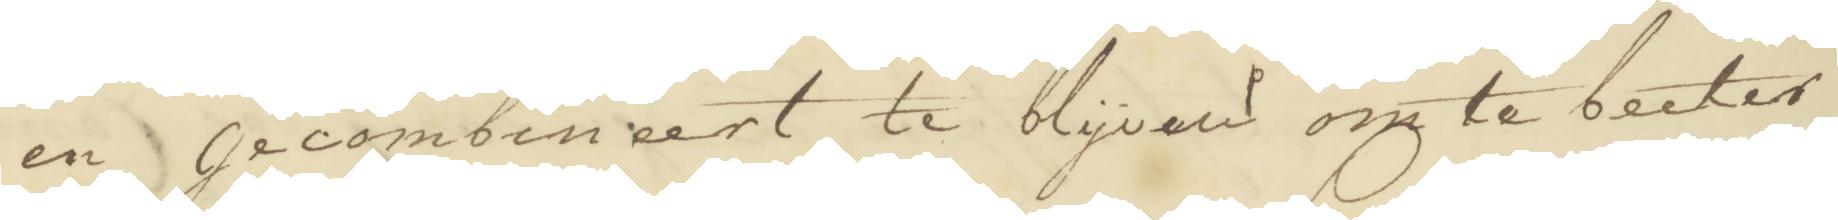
en gecombineert te blijven om te beeter
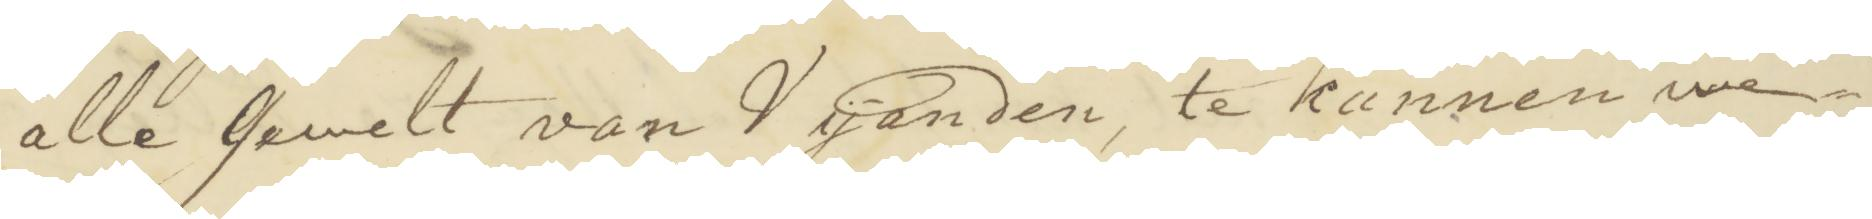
alle gewelt van vijanden, te kunnen we=
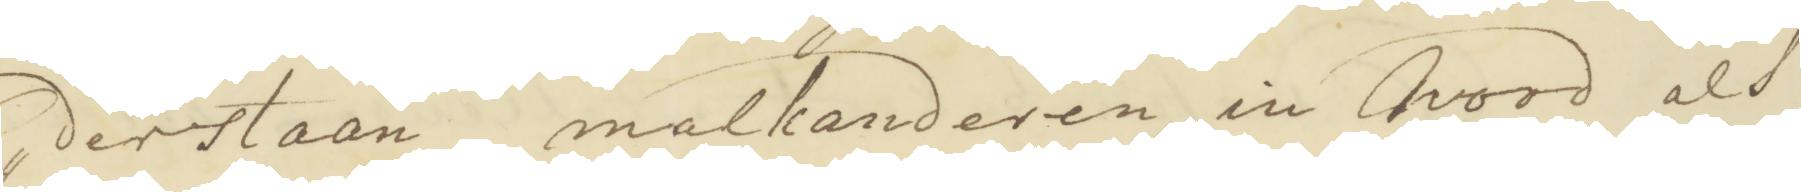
„derstaan, malkanderen in nood als
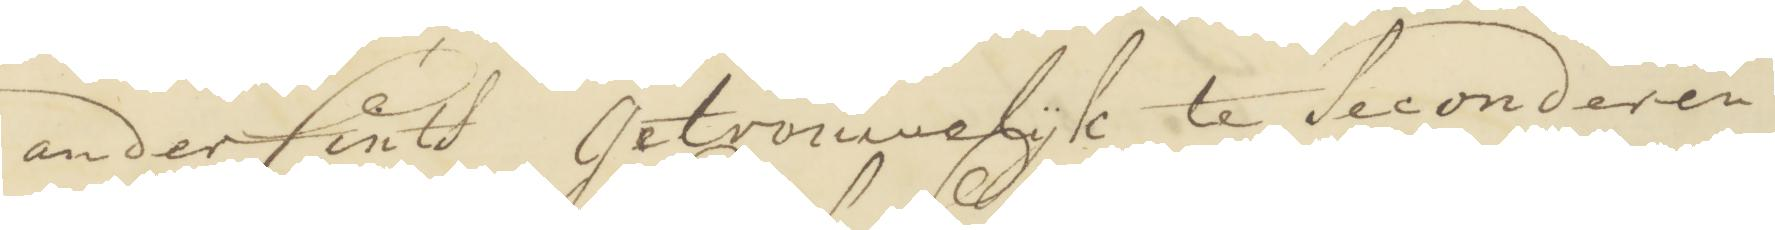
andersints getrouwelijk te seconderen
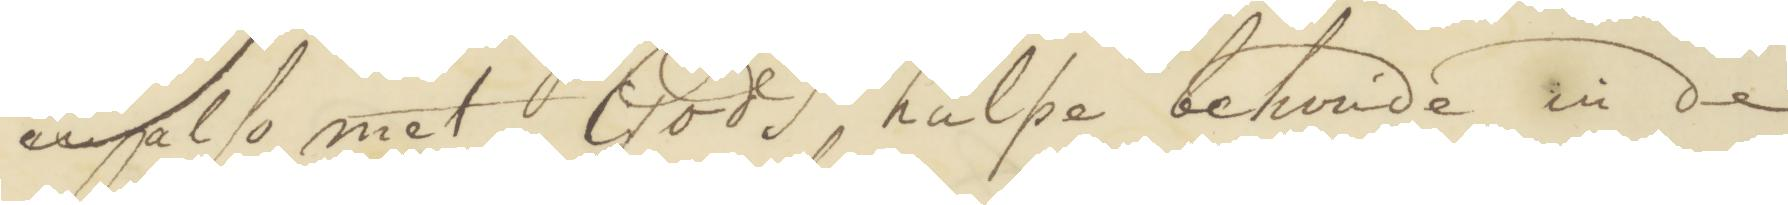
en also met Godes hulpe behoude in de
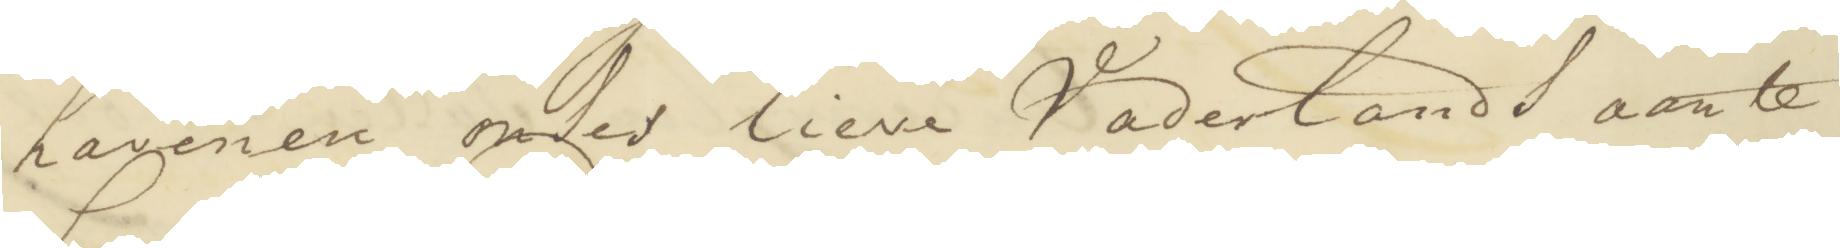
havenen onses lieve Vaderlands aan te
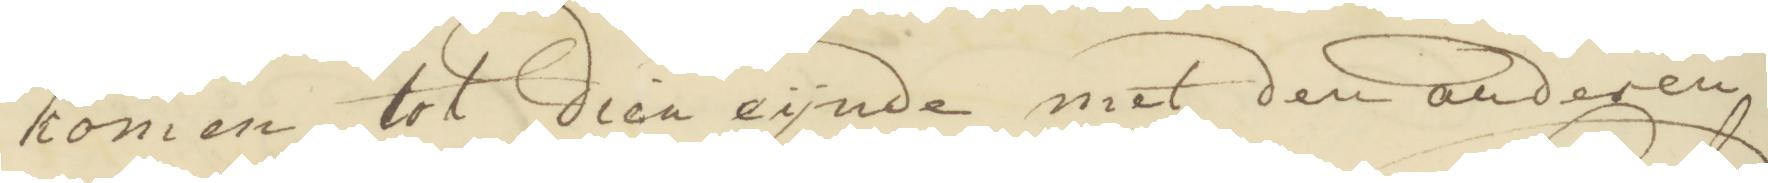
komen, tot dien eijnde met den anderen
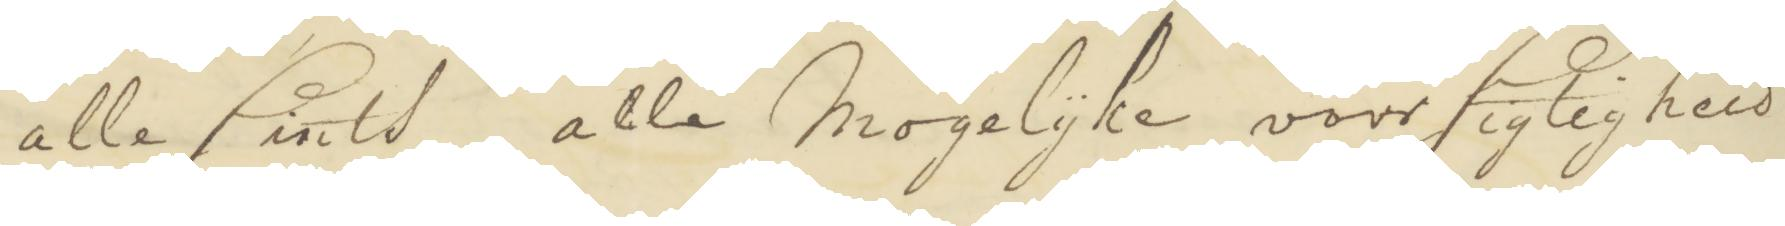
alle sints alle mogelijke voorsigtigheid
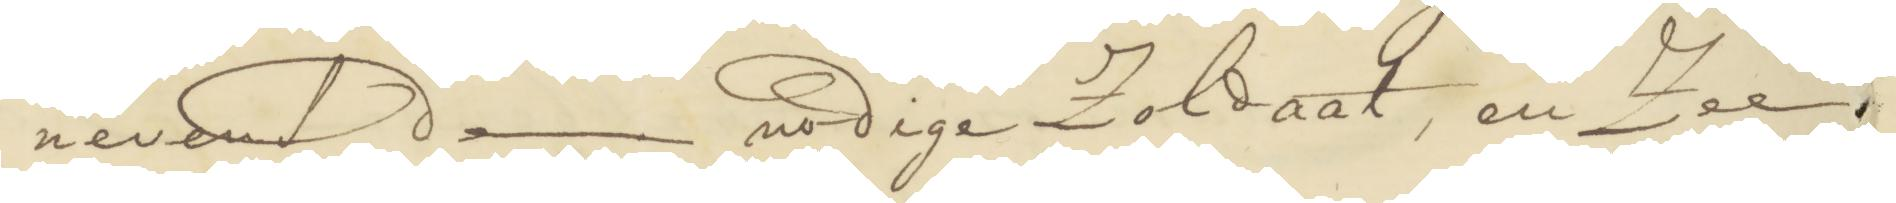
nevens de nodige Zoldaat, en Zee
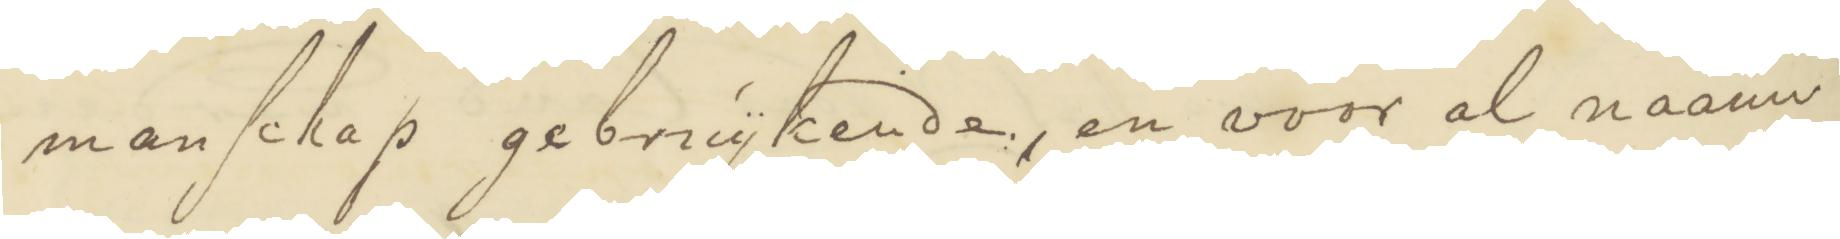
manschap gebruijkende, en voor al naauw
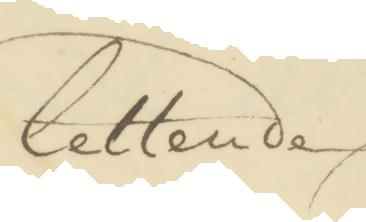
lettende
